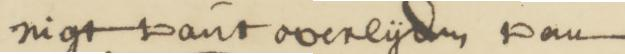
rigt van ’t overlijden van
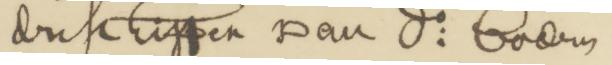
den schipper van d:o bodem
